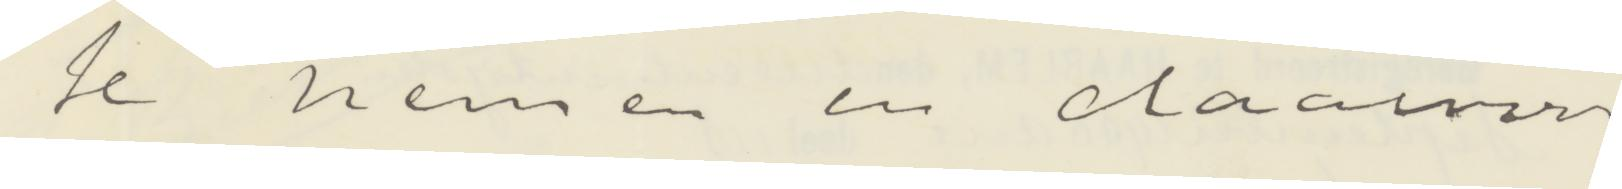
te nemen en daarvan
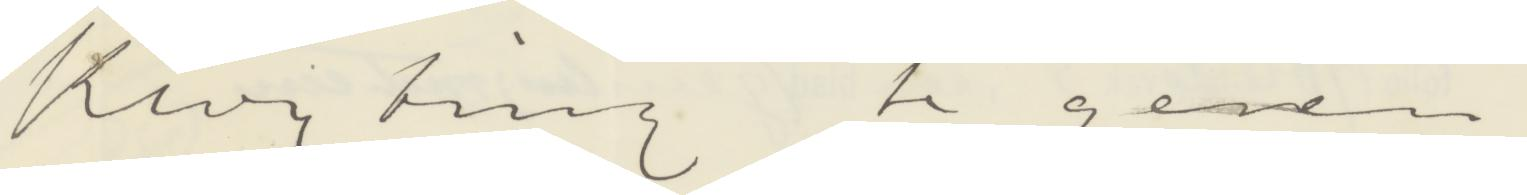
kwijting te geven
